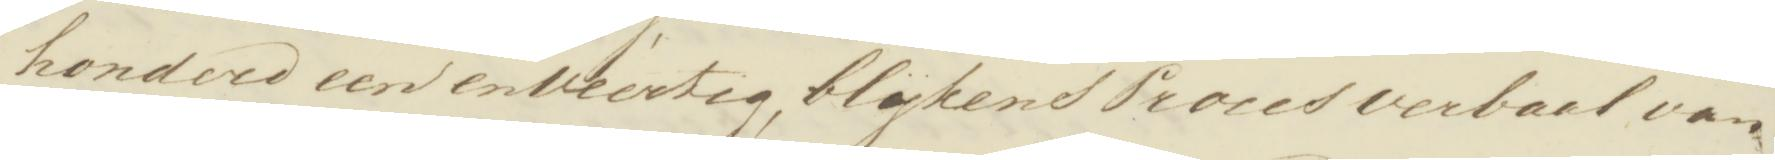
honderd een en veertig, blijkens Proces verbaal van
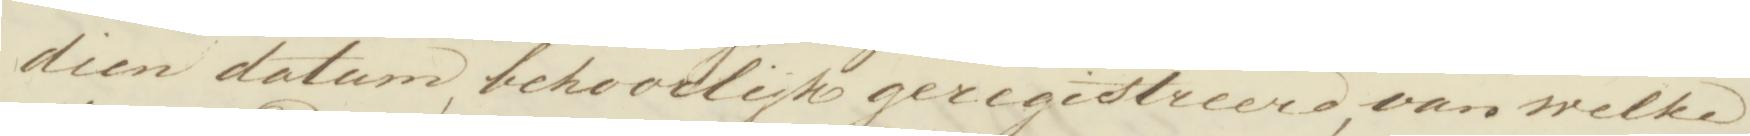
dien datum, behoorlijk geregistreerd, van welke
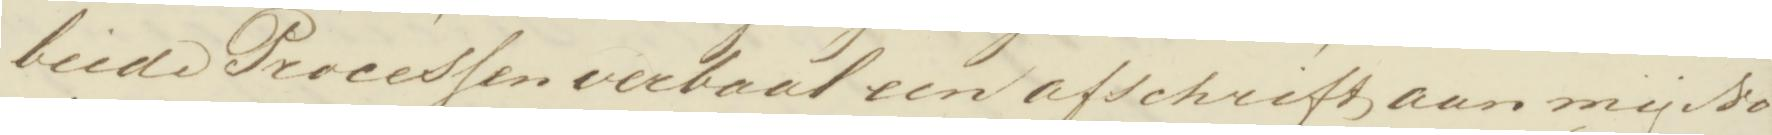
beide Processen verbaal een afschrift aan mij No
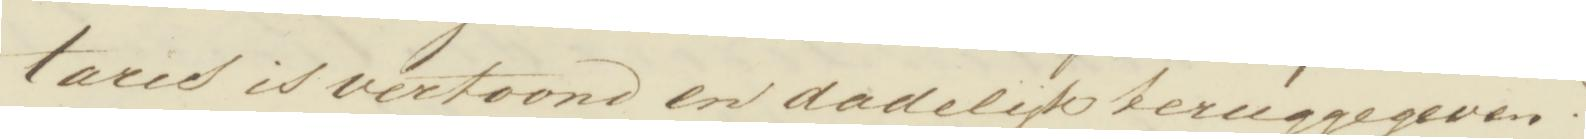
taris is vertoond en dadelijk teruggegeven.
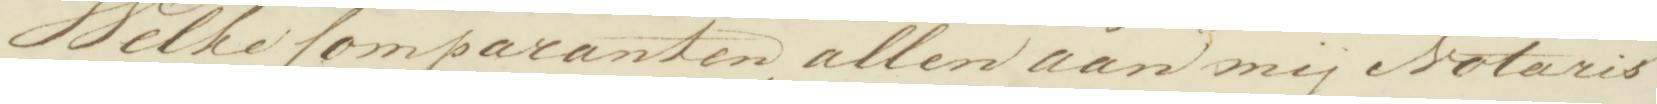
Welke Comparanten, allen aan mij Notaris
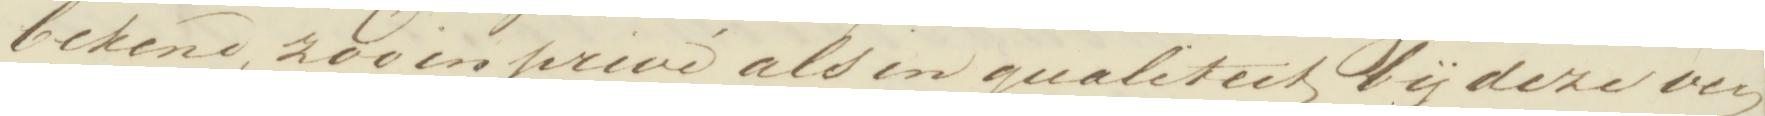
bekend, zoo in privé als in qualiteit, bij deze ver
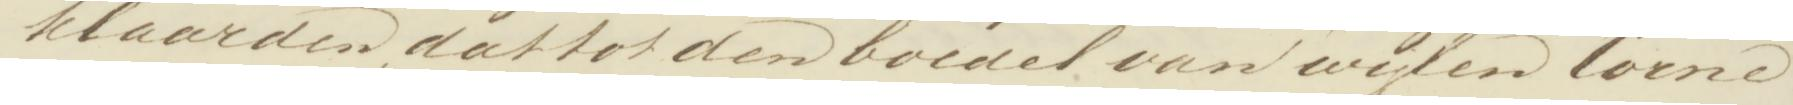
klaarden, dat tot den boedel van wylen Corne
